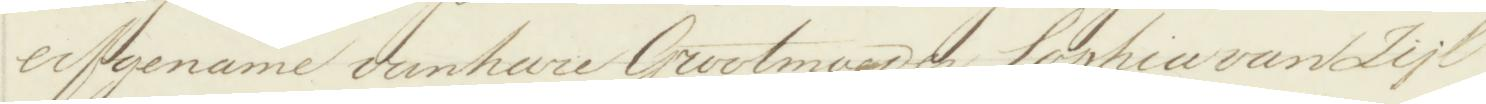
erfgename van hare Grootmoeder Sophia van Zijl
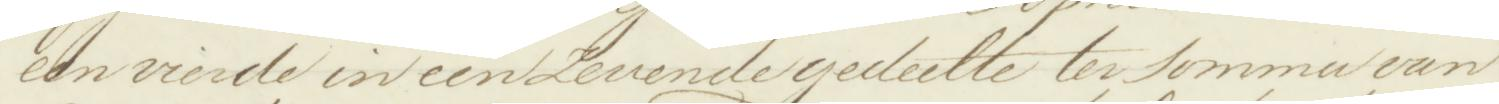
een vierde in een Zevende gedeelte ter somma van
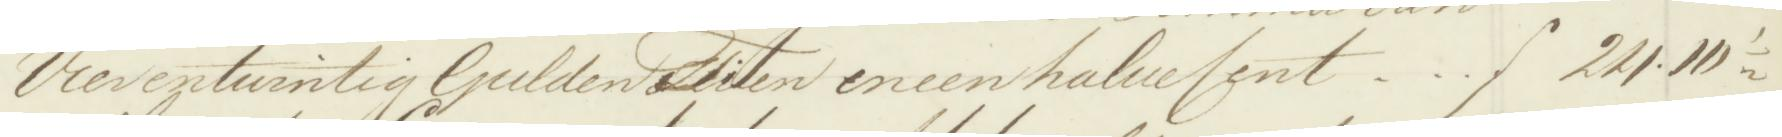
Vier en twintig Gulden Tien en een halve Cent . . . ƒ 24: 10½
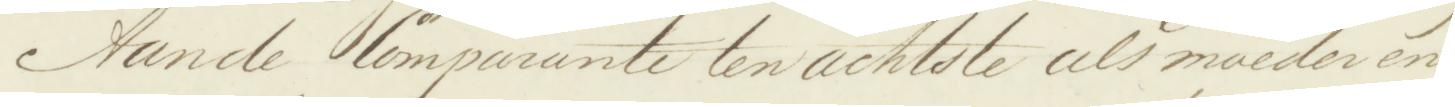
Aan de Comparante ten achtste als moeder en
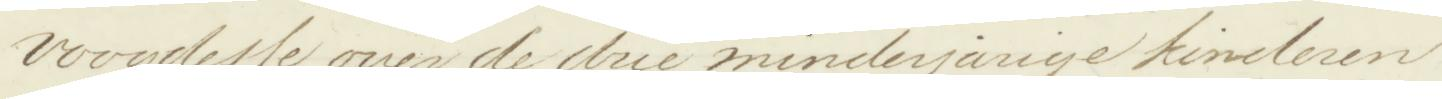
voogdesse over de drie minderjarige kinderen
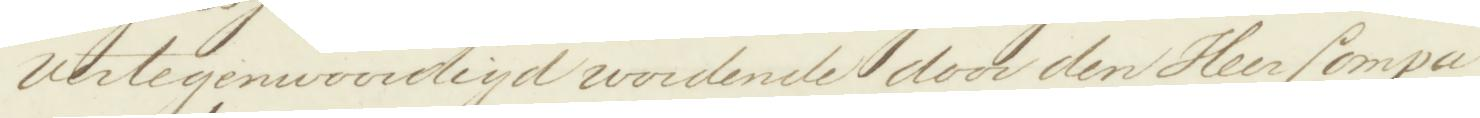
vertegenwoordigd wordende door den Heer Compa
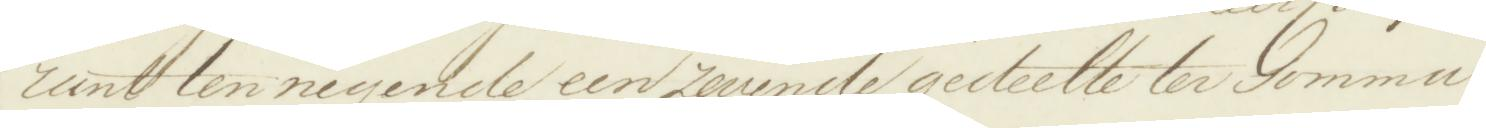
rant ten negende, een zevende gedeelte ter somma
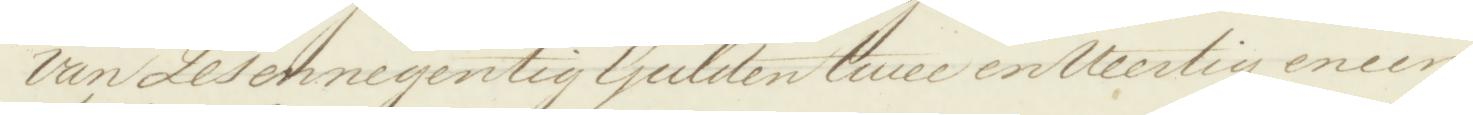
van Zes ennegentig Gulden twee en Veertig en een
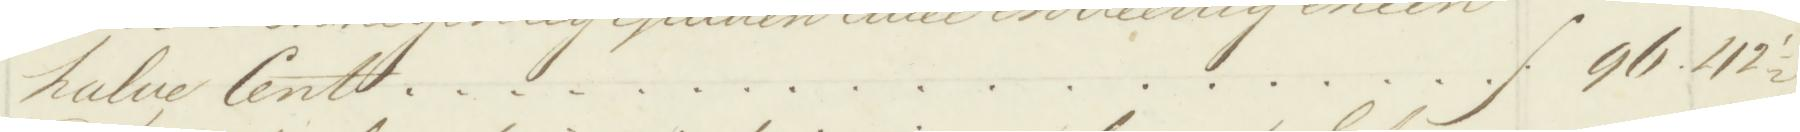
halve Cent . . . . . . . . . . . . . . . . . . . . ƒ 96. 42½
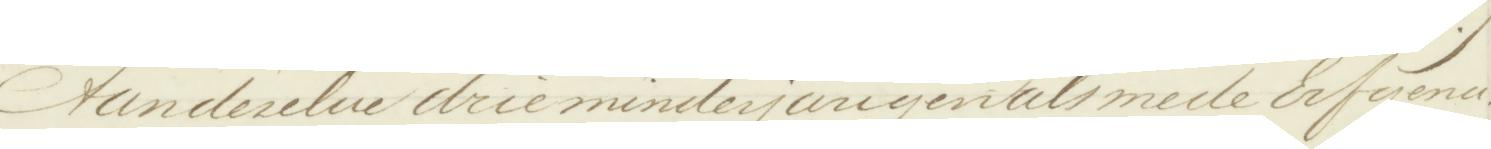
Aan dezelve drie minderjarigen alsmede Erfgena
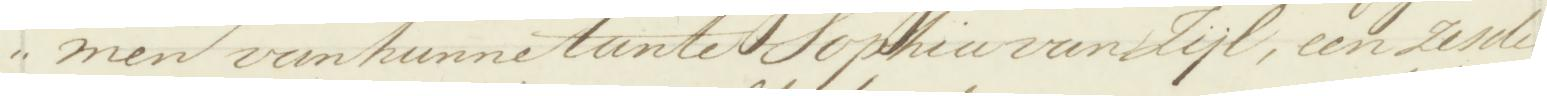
„men van hunne tante Sophia van Zijl, een zesde
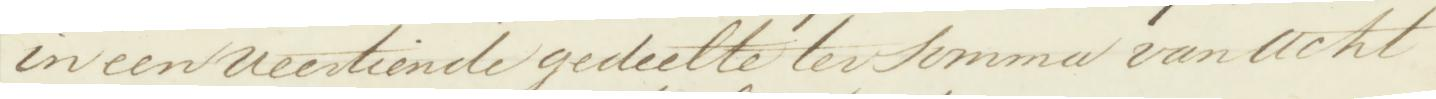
in een veertiende gedeelte ter somma van acht
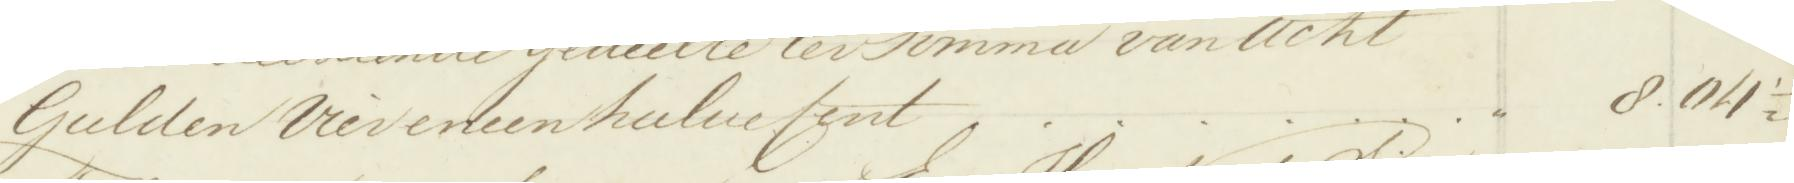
Gulden vier en een halve Cent . . . . . . . . „ 8.04½
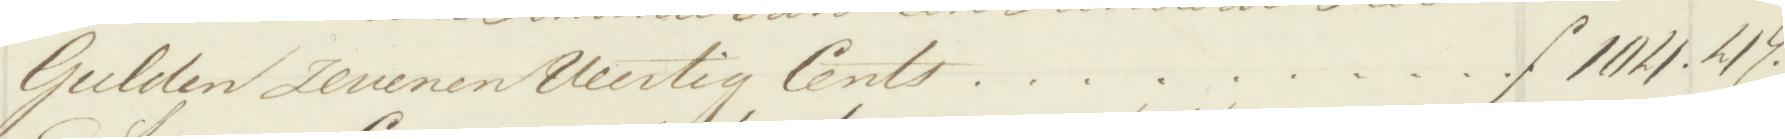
Gulden Zevenen Veertig Cents . . . . . . . . . . ƒ 104:47.
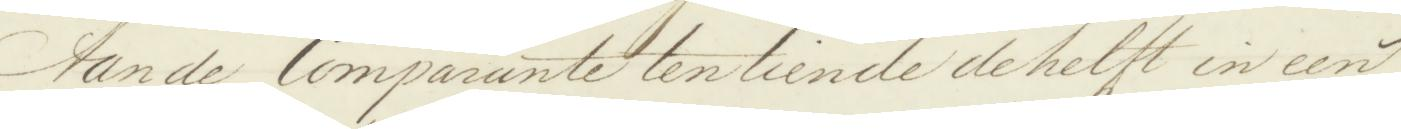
Aan de Comparante ten tiende de helft in een
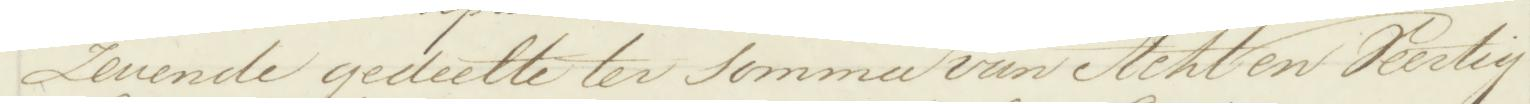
Zevende gedeelte ter somma van Acht en Veertig
